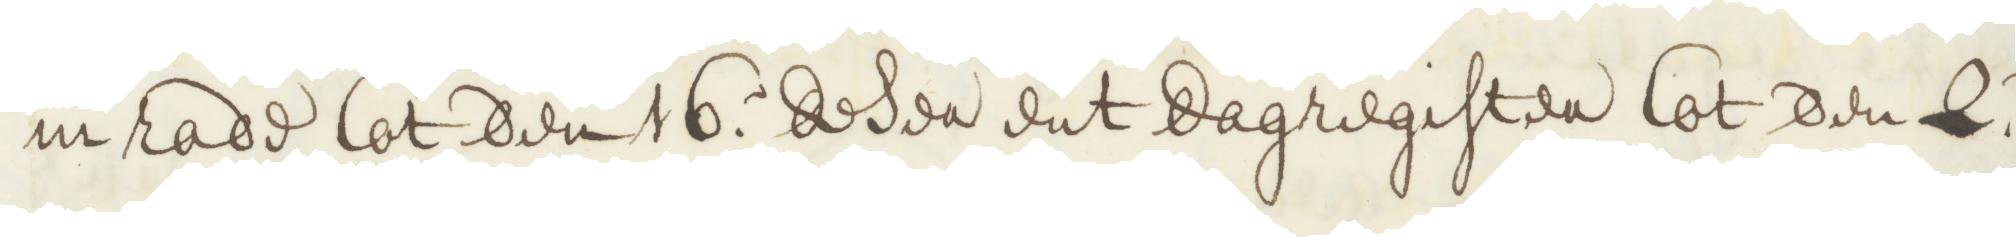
in rade tot den 16.' deser en't dagregister tot den 2
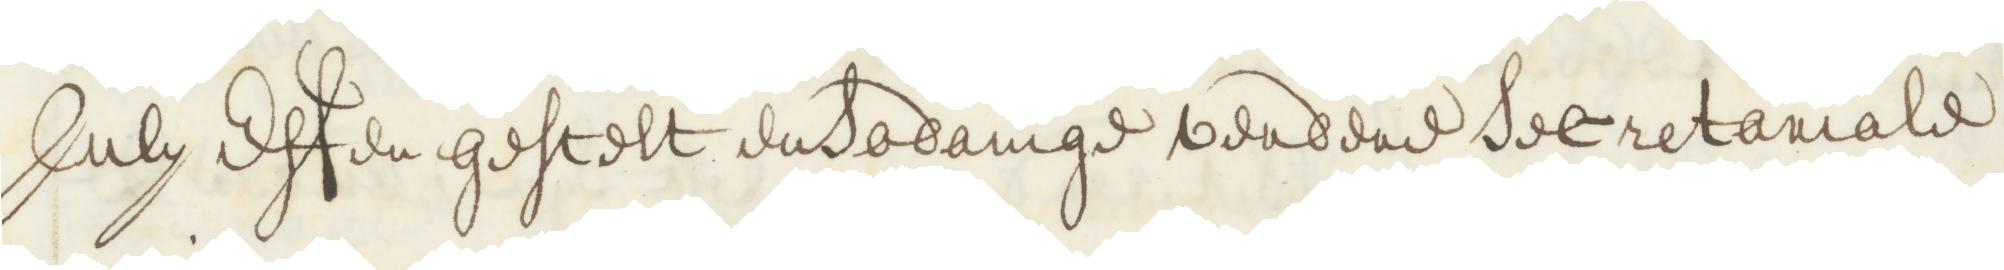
July Effen gestelt en sodanige verdere secretariale
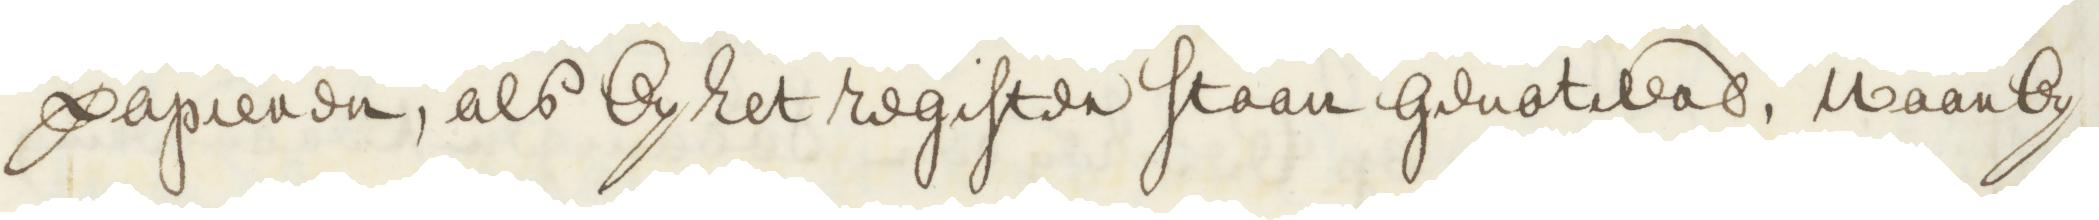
papieren, als by het register staan genoteerd; waar by
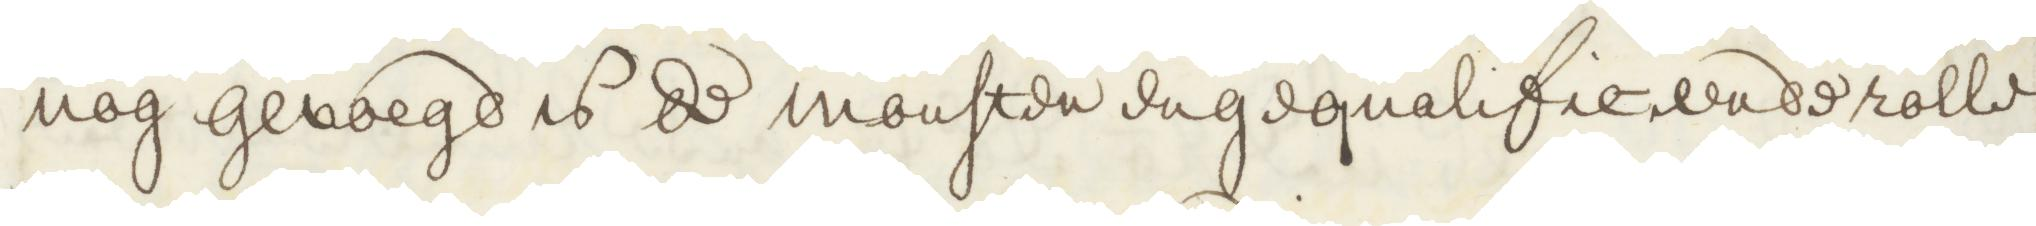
nog gevoegd is de monster en gequalificeerde rolle
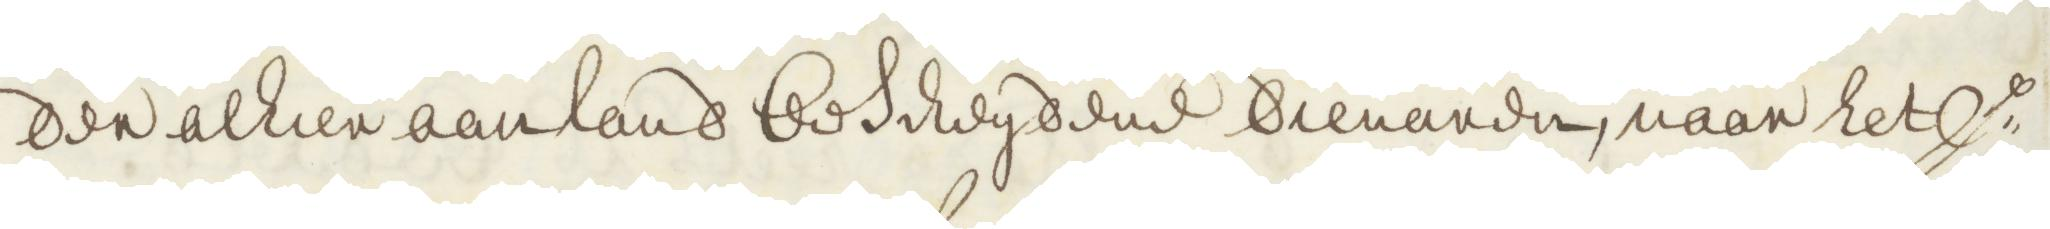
der alhier aan land bescheydene dienaren, naar het J„o
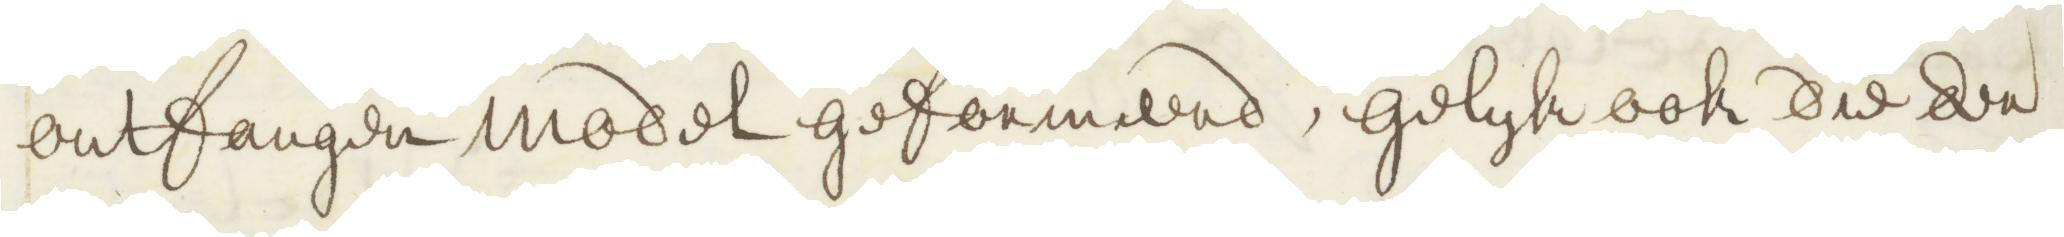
ontfangen model geformeerd, gelyk ook die der
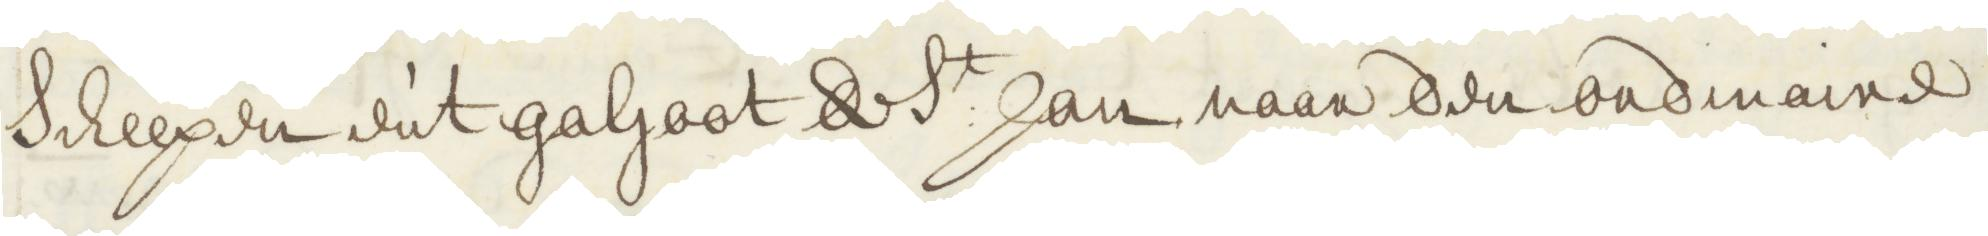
scheepen en’t galjoot de s:t Jan naar den ordinaire
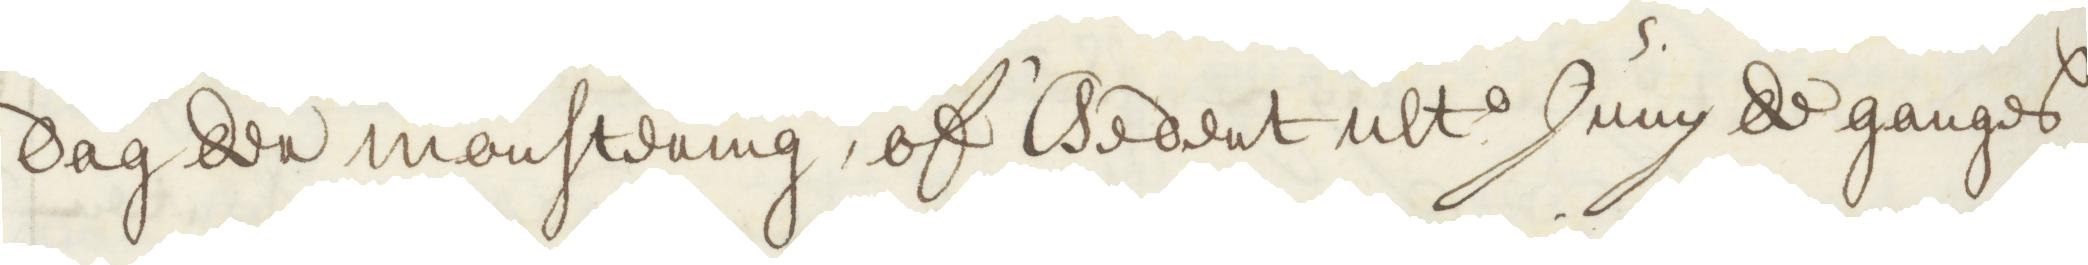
dag der monstering, of 'tsedert ult:o Juny de ganges
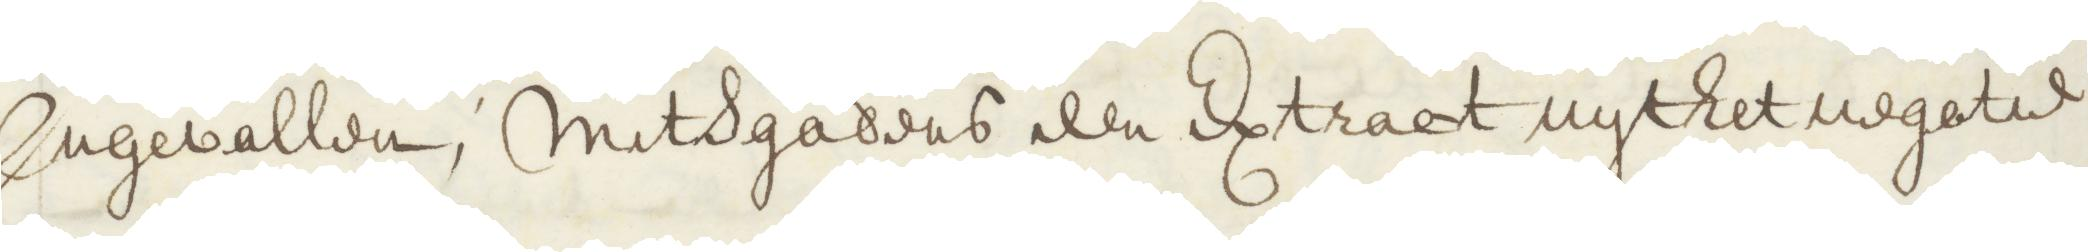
Jngevallen; mitsgaders een Extract uyt het negotie
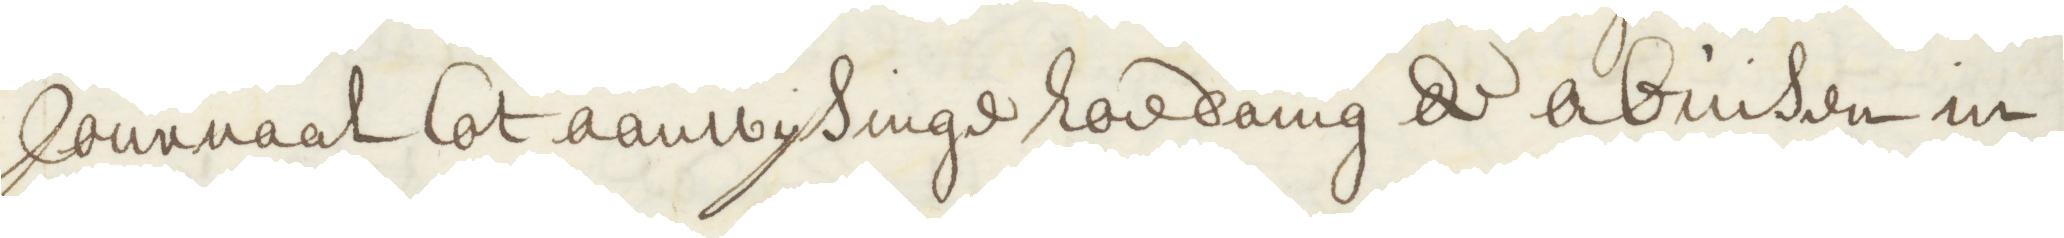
Journaal tot aanwijsinge hoedanig de abuisen in
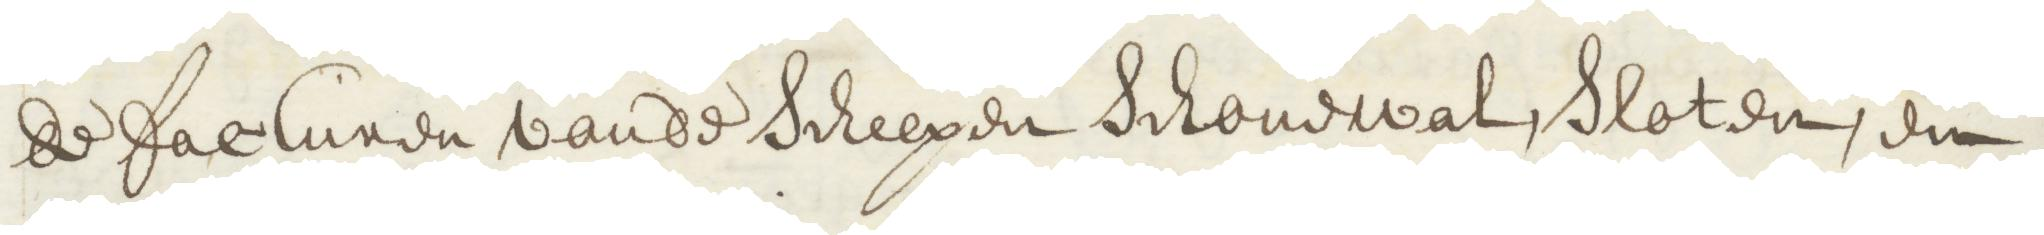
de facturen van de scheepen schonewal, sloten, en
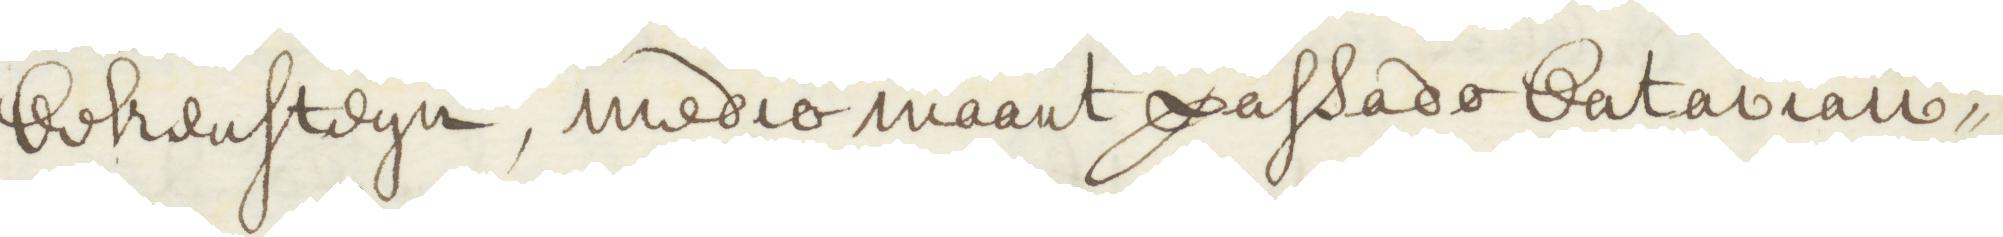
bekensteyn, medio maart passado batavia w„t
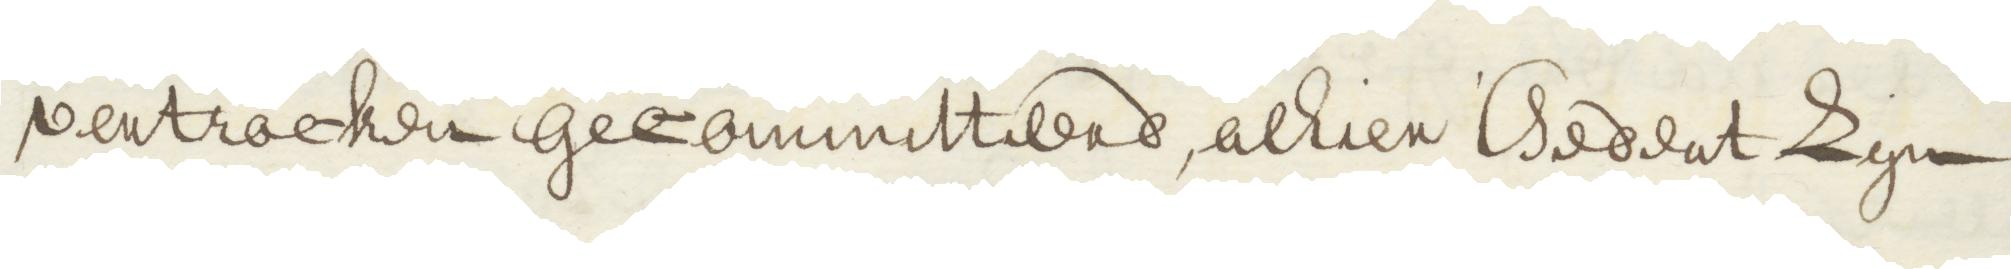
vertrocken gecommitteerd, alhier 't sedert zijn
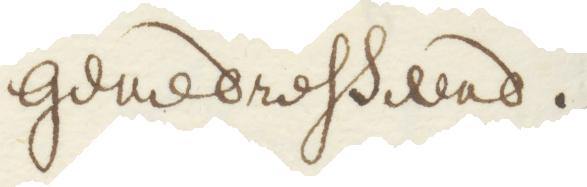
geredresseerd.
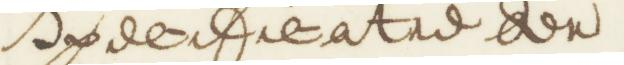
specificatie der
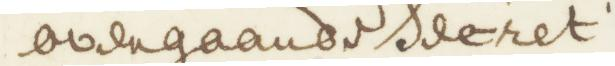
overgaande secret'e
